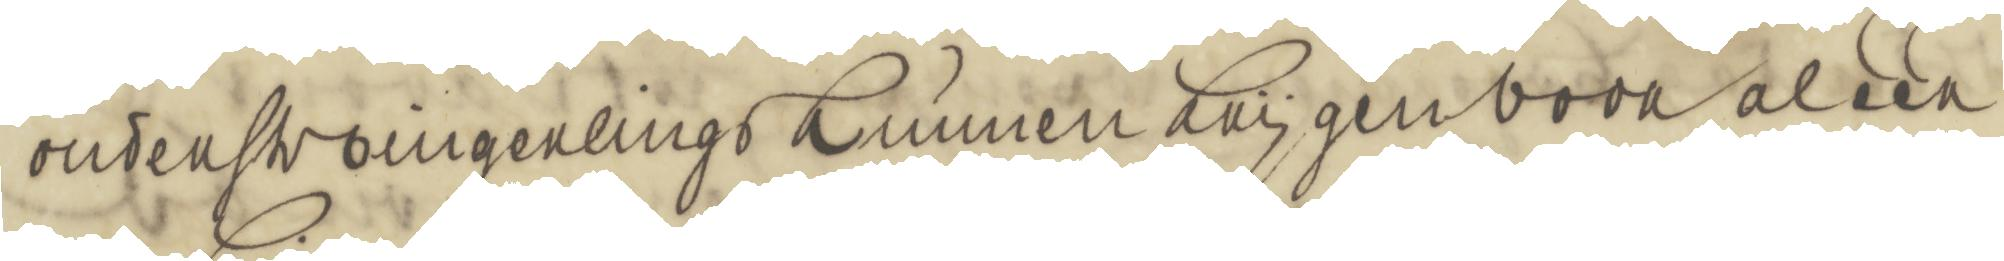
onderste vingerlings kunnen krijgen voor aleer
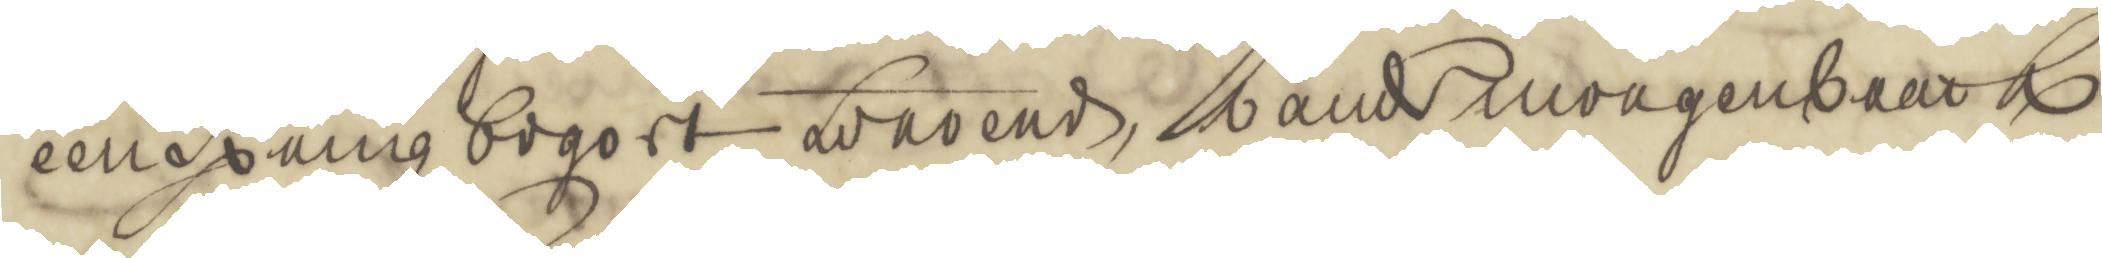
een spring begost te roeren, vande morgen brack
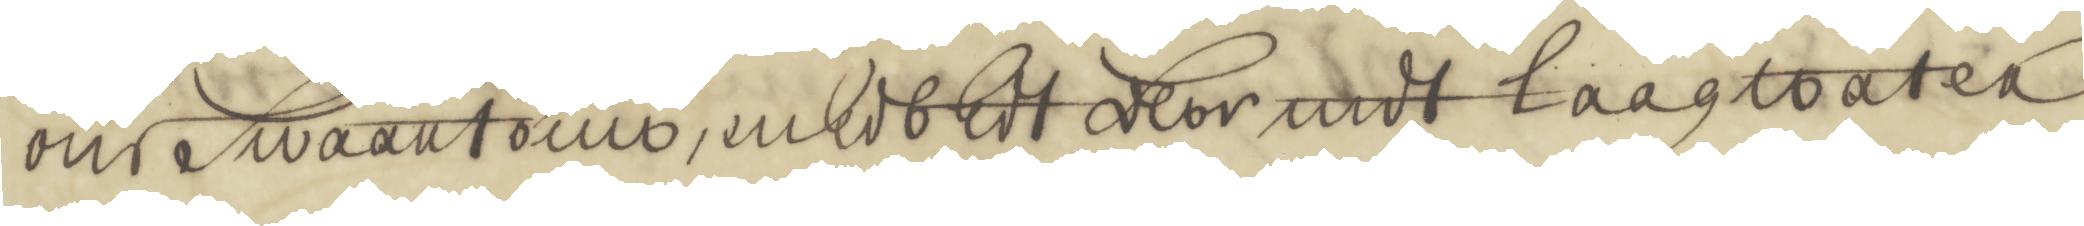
ons swaartouw, en heb het verlor met laag water
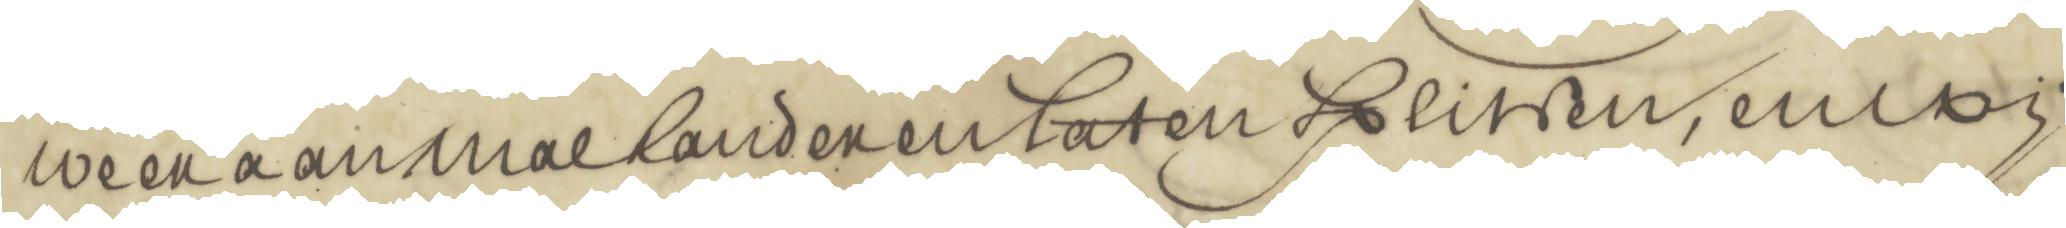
weer aan malkanderen laten splitsen, en wij
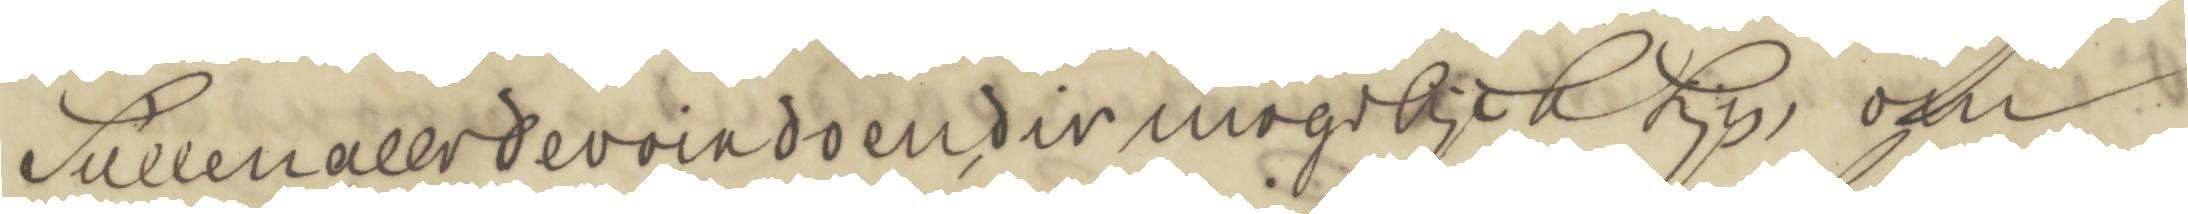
sullen alle devoir doen, die mogelijck sijn, om
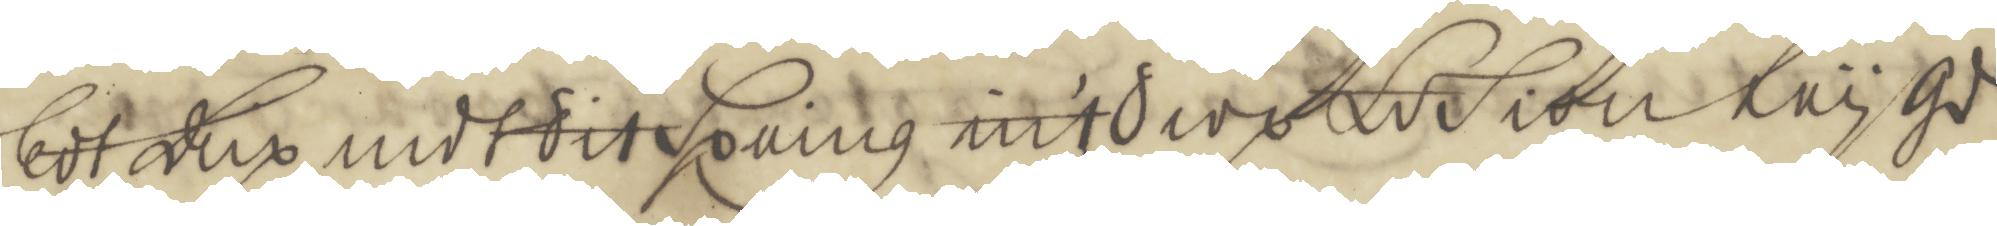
het schip met dit spring in’t diep te Sien krijgen
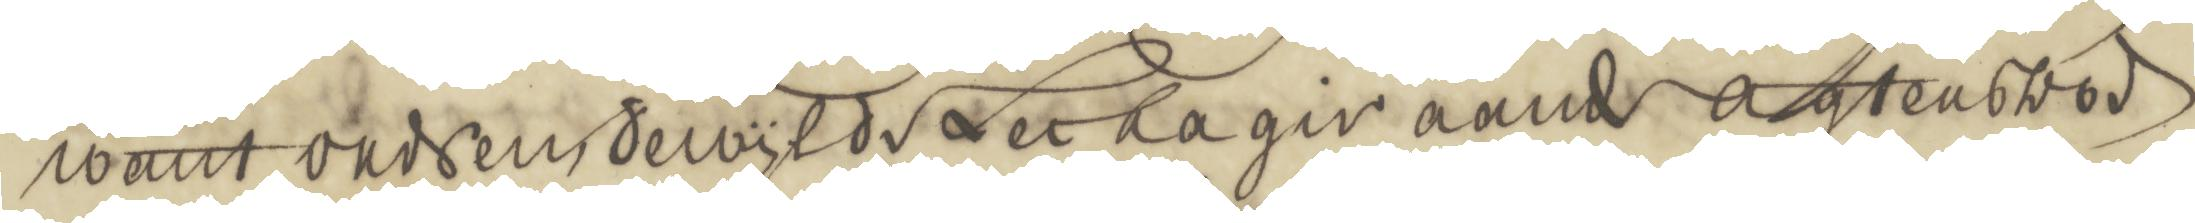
want vresen, dewijl de leckagie aande agtersteven
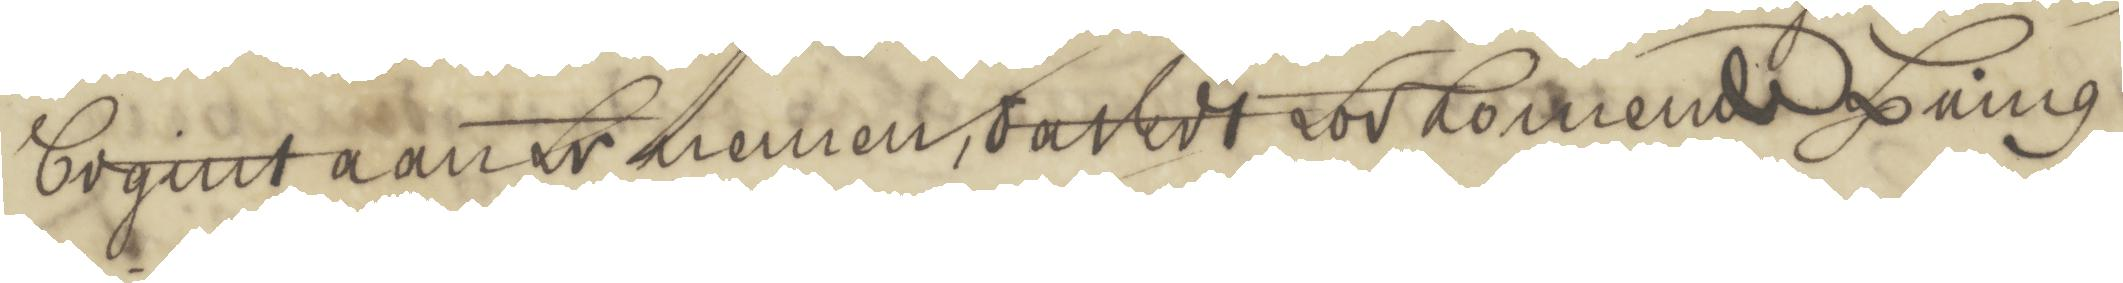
begint aant te nemen, dat het toe komende spring
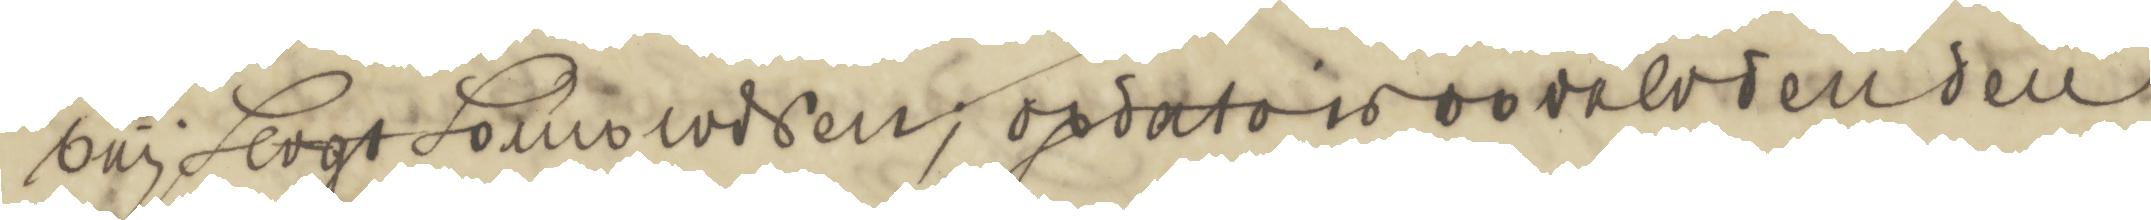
vrij slegt souw wesen; op dato is overleden den
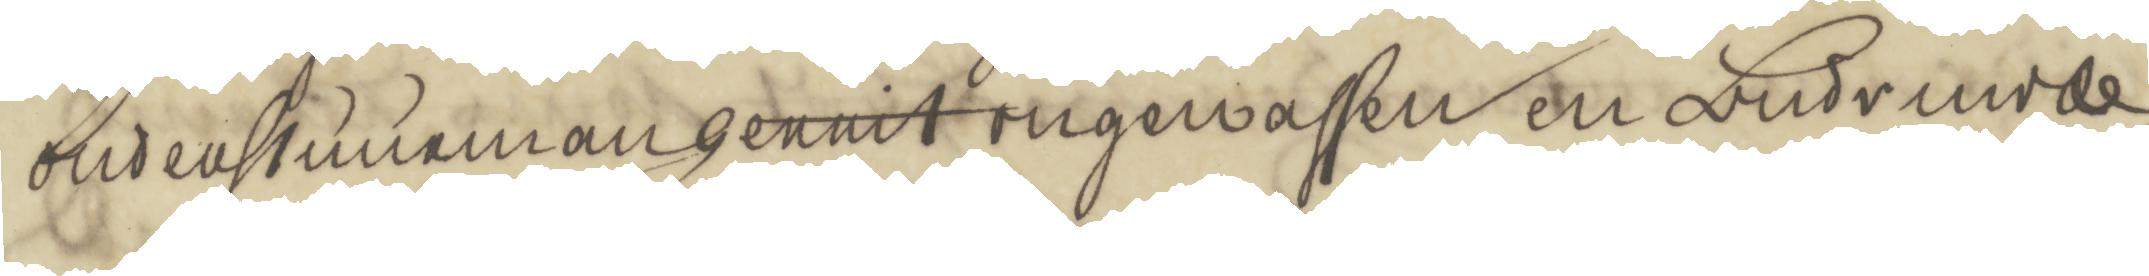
onderstuurman gerrit ongewassen en Sende mede
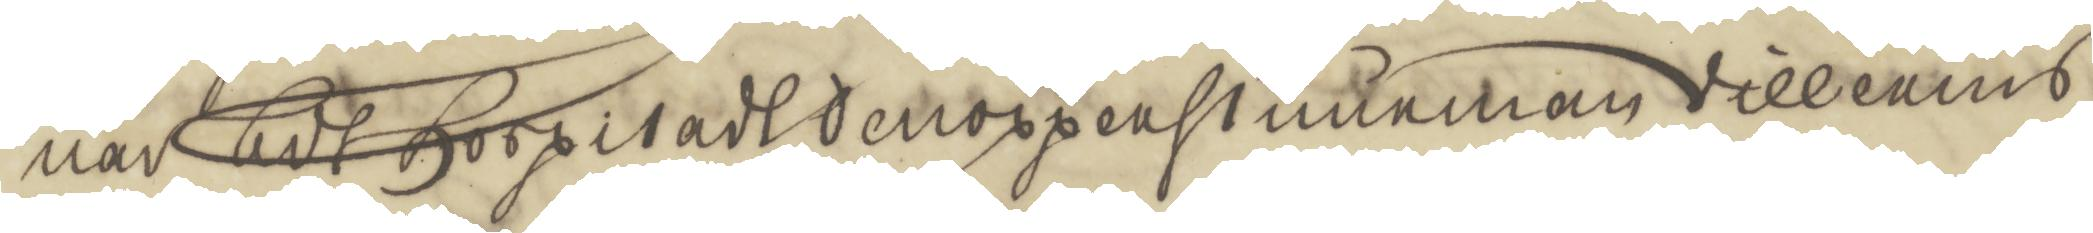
nae het Hospitael den opperstuurman Villerius,
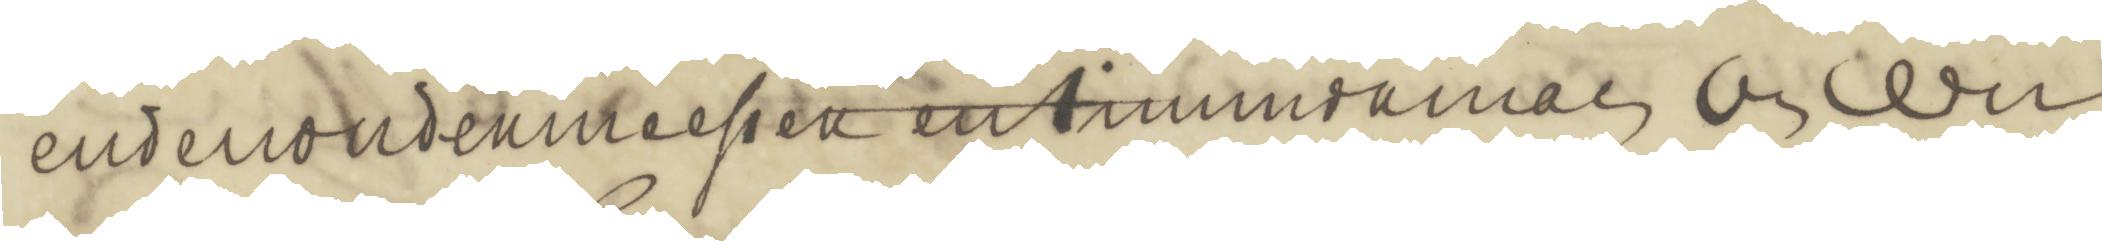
en den ondermeester en timmerman en een
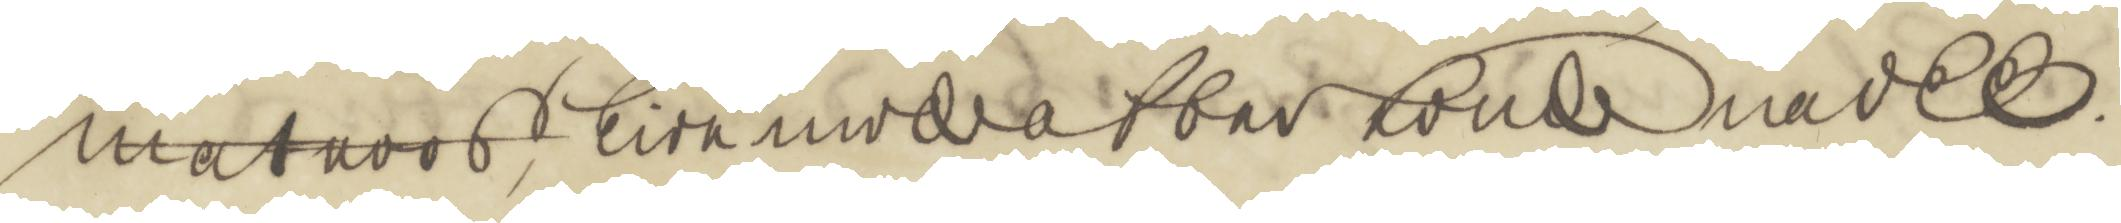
matroos, hier mede afbrekende na vEE.
